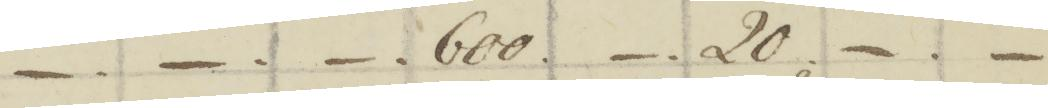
—. —. —. 600. —. 20. —. —
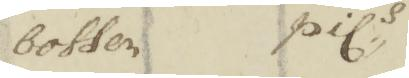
bossen pic„s
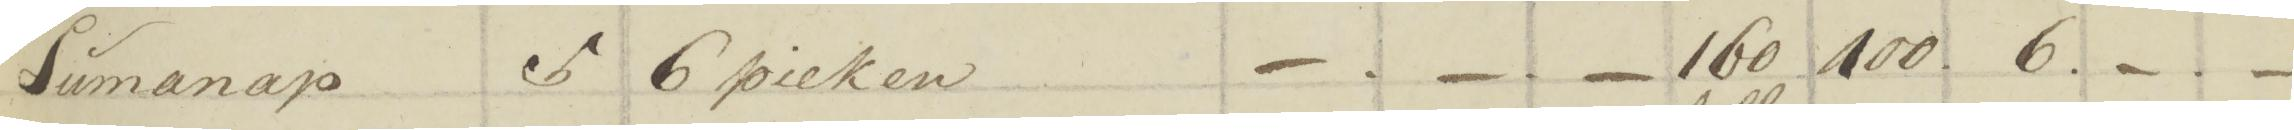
Sumanap 5 6 pieken —. —. — 160 400. 6. —. —
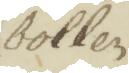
bollen
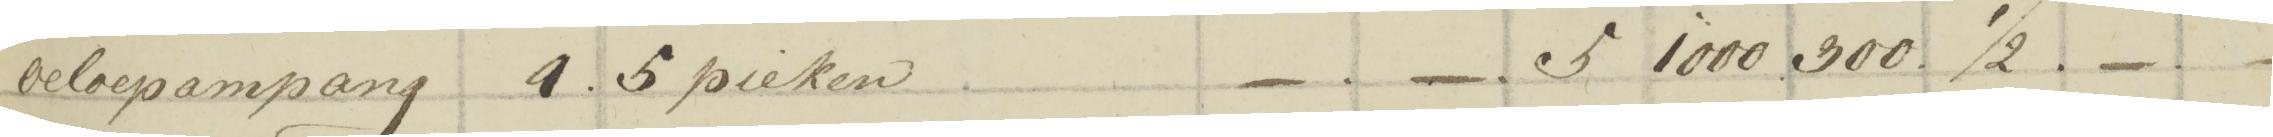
beloepampang 4. 5 pieken —. —. 5 1000. 300. ½. —. —
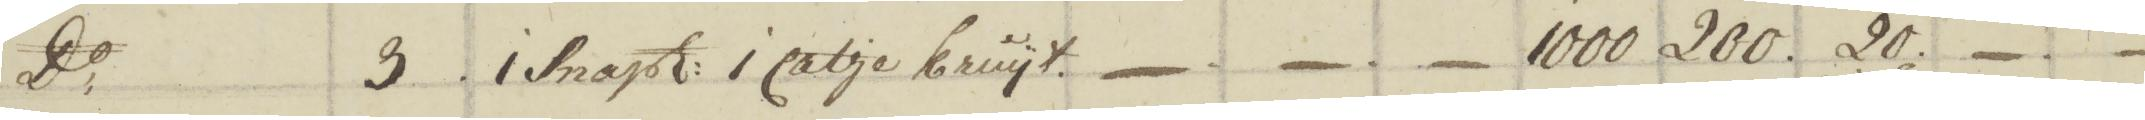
D„o 3. 1 snaph: 1 Catje kruijt. —. —. — 1000 200. 20. —. —
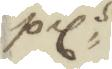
pic„s
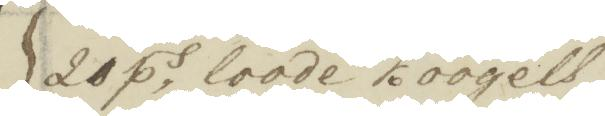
{ 20 p„s loode koogels
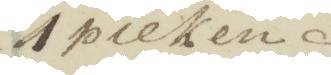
4 pieken —
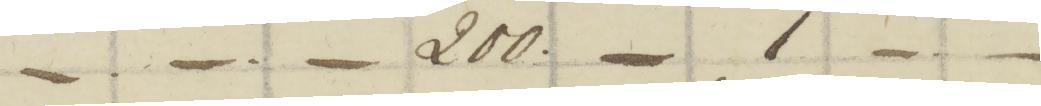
—. —. — 200. — 1 —. —
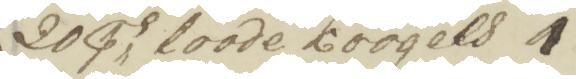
20 p„s loode koogels 4
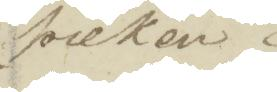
pieken —
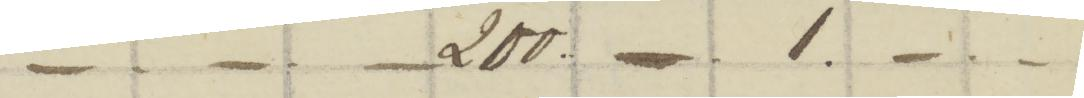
—. —. — 200. —. 1. —. —
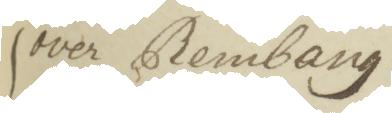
{ over Rembang
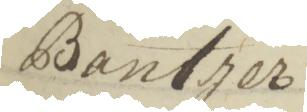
Bantjer
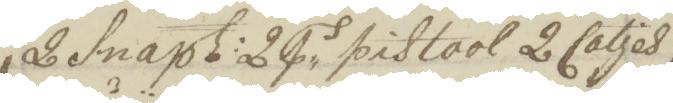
2 snaph: 2 p„s pistool 2 Catjes
